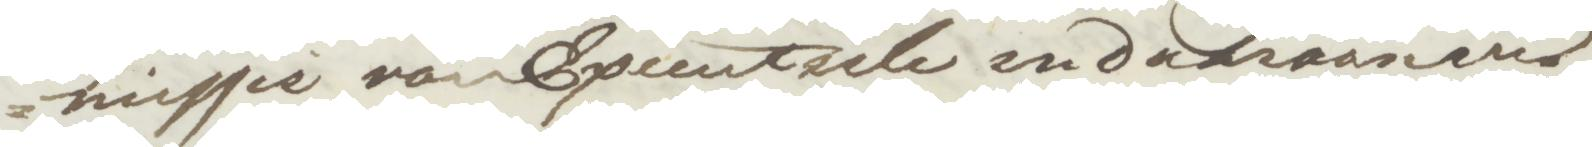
=missie van extenteele en daaraan ver
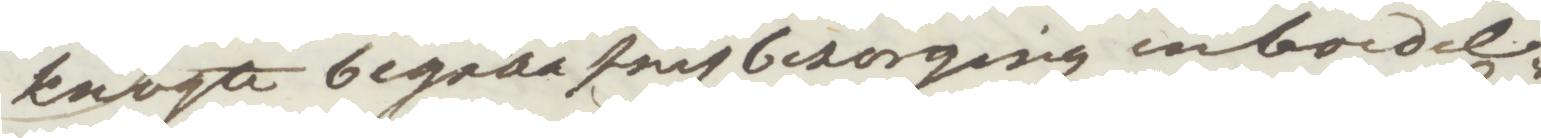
knogte begraafnis bezorging en boedel„
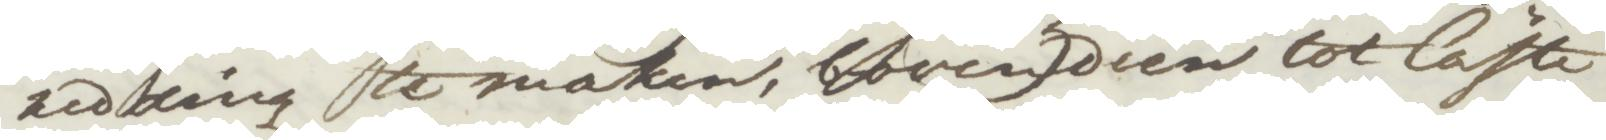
redding te maken, bovendien tot laste
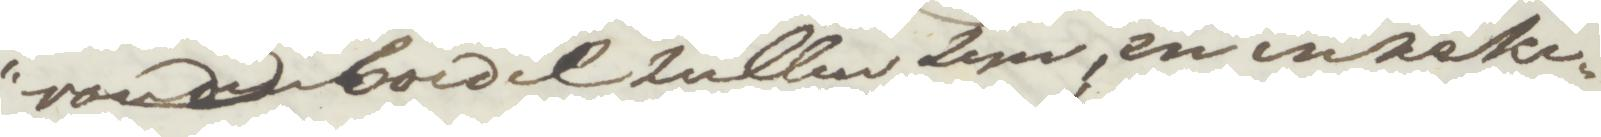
van den boedel zullen zyn, en in reke„
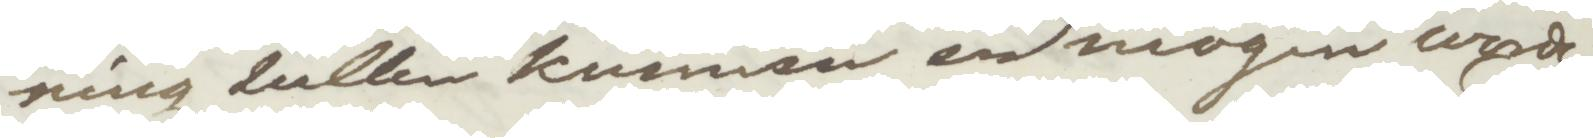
ning zullen kunnen en mogen worden
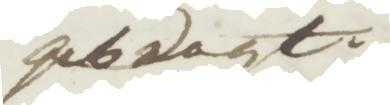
gebragt.
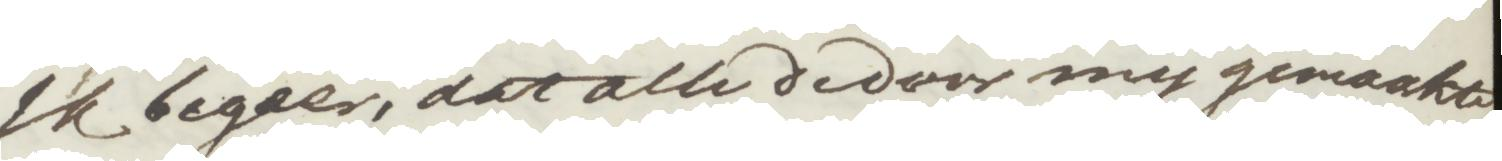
Jk begeer, dat alle de door my gemaakte
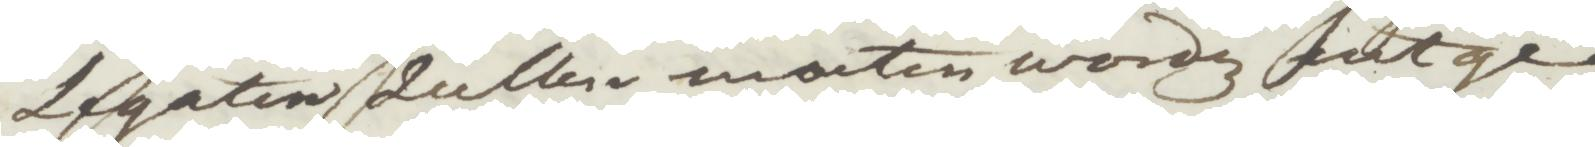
Legaten zullen moeten worden uitge
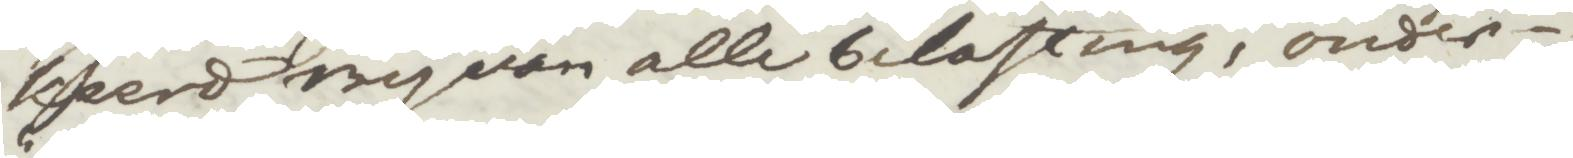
keerd vry van alle belasting, onder
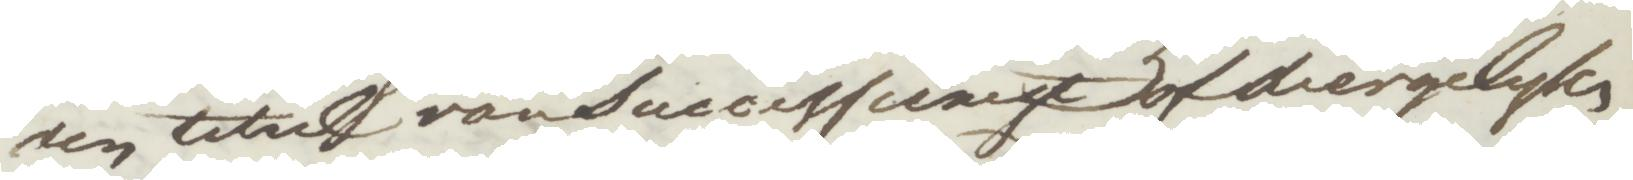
den titul van Successieregt of diergelyk,
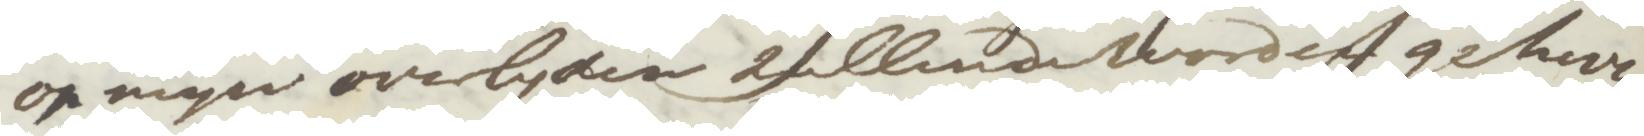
op myn overlyden zullende worden geheven
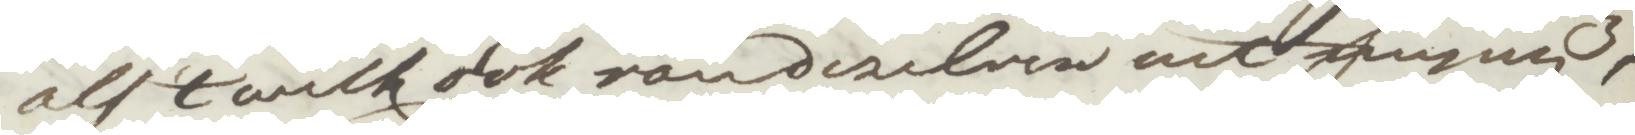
als 't welk ook van dezelven uit mynen,
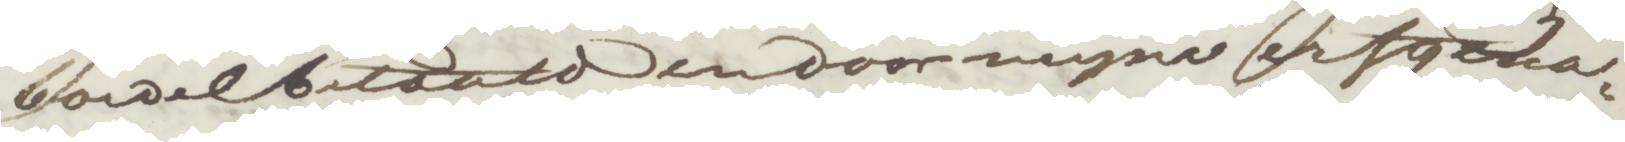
boedel betaald en door mynen erfgena„
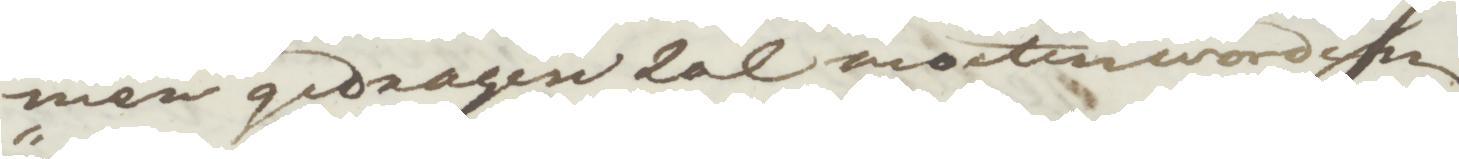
„men gedragen zal moeten worden.
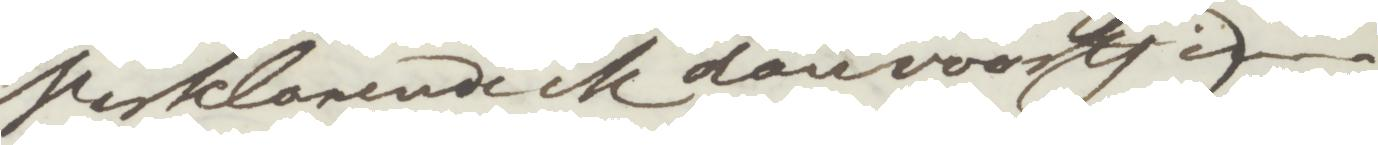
Verklarende ik dan voorts in
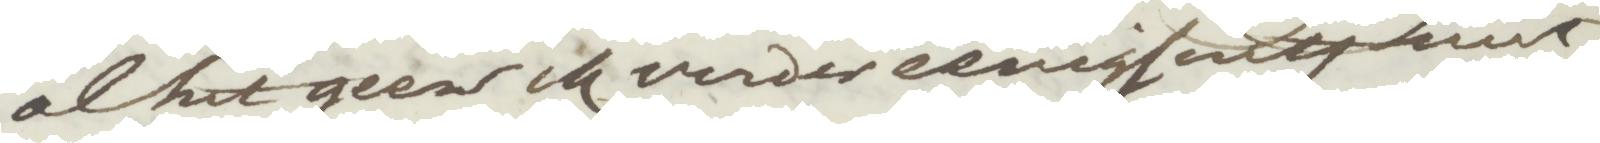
al het geen ik verder eenigszints met
